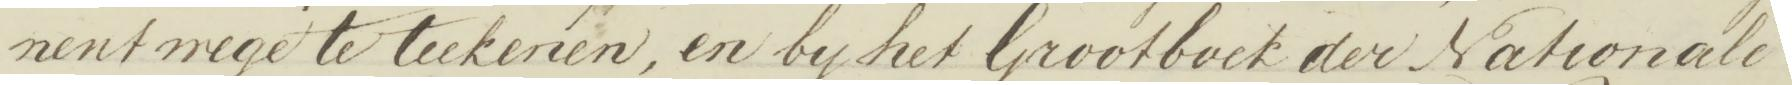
nent wege te teekenen, en by het Grootboek der Nationale
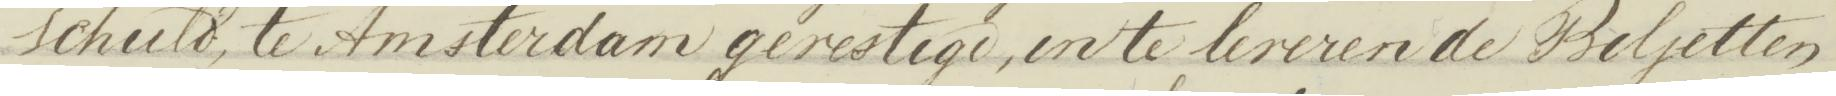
schuld, te Amsterdam gevestigd, in te leveren de Biljetten
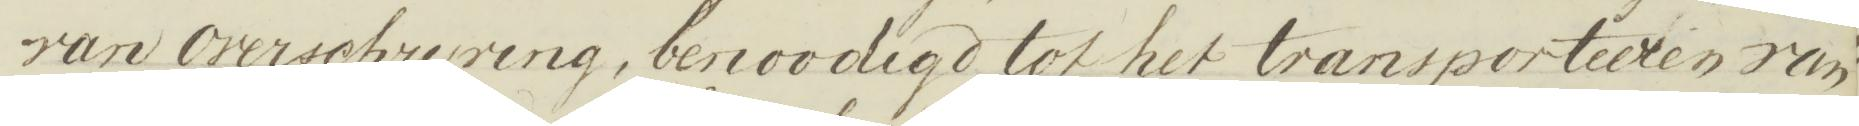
van Overschryving, benoodigd tot het transporteeren van
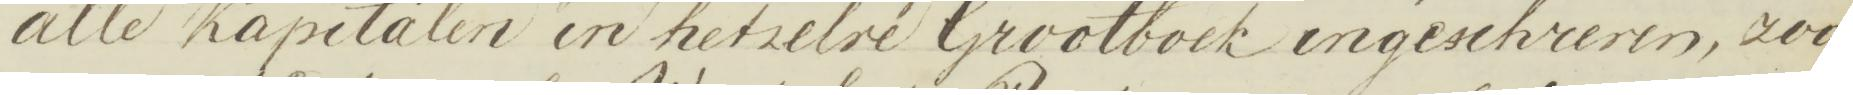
alle Kapitalen in hetzelve Grootboek ingeschreven, zoo
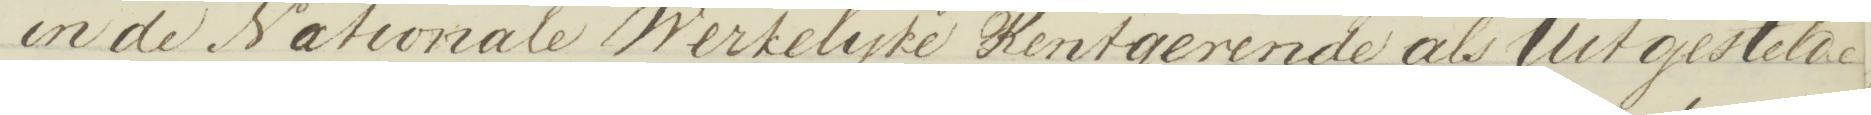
in de Nationale Werkelyke Rentgevende als Uitgestelde
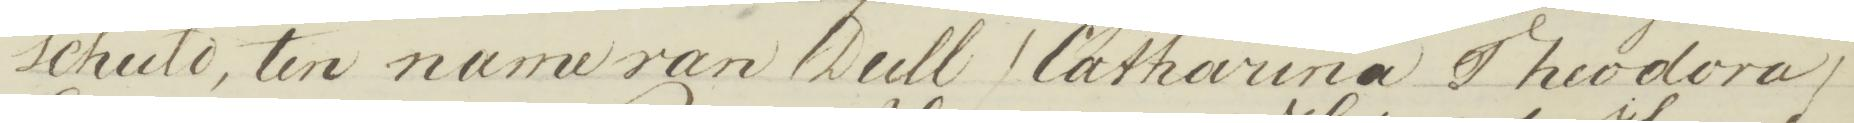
schuld, ten name van Dull /Catharina Theodora/
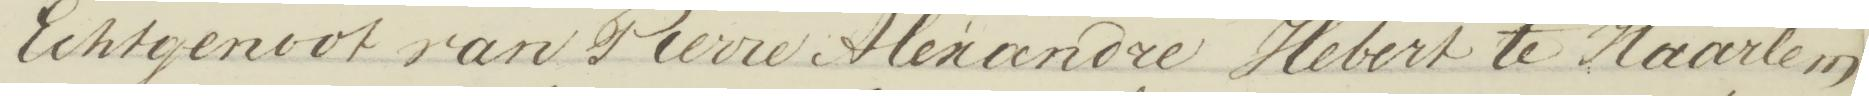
Echtgenoot van Pierre Alexandre Hebert te Haarlem
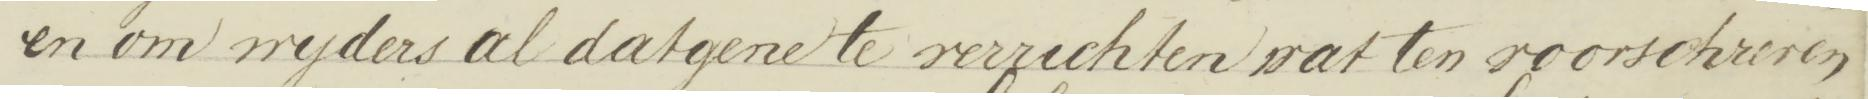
en om wyders al datgene te verrichten wat ten voorschreven
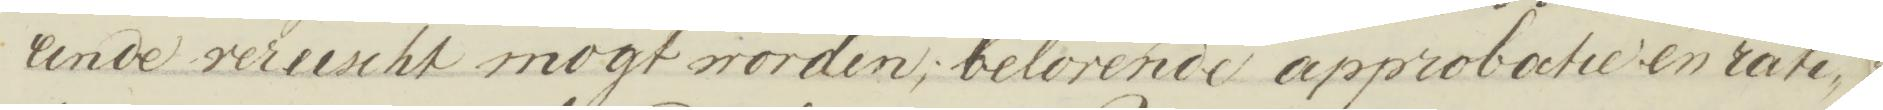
einde vereicht mogt worden; belovende approbatie en rati„
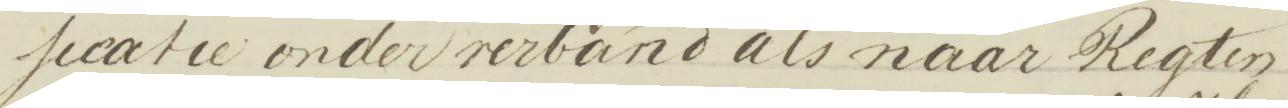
ficatie onder verband als naar Regten
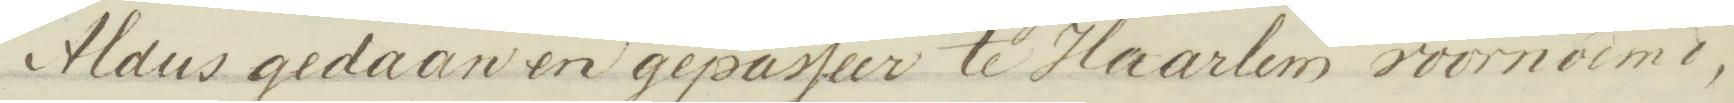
Aldus gedaan en gepasseer te Haarlem voornoemd,
